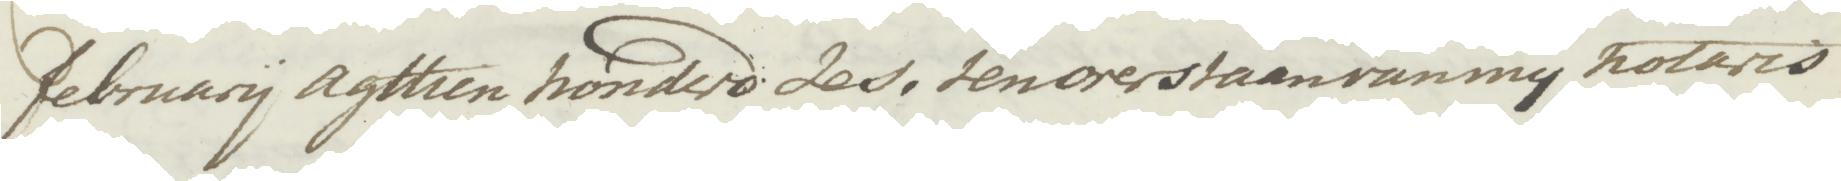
Februarij agttien honderd zes, ten overstaan van mij notaris
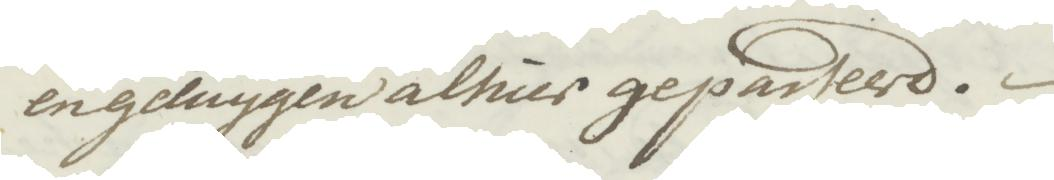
en getuygen alhier gepasseerd.
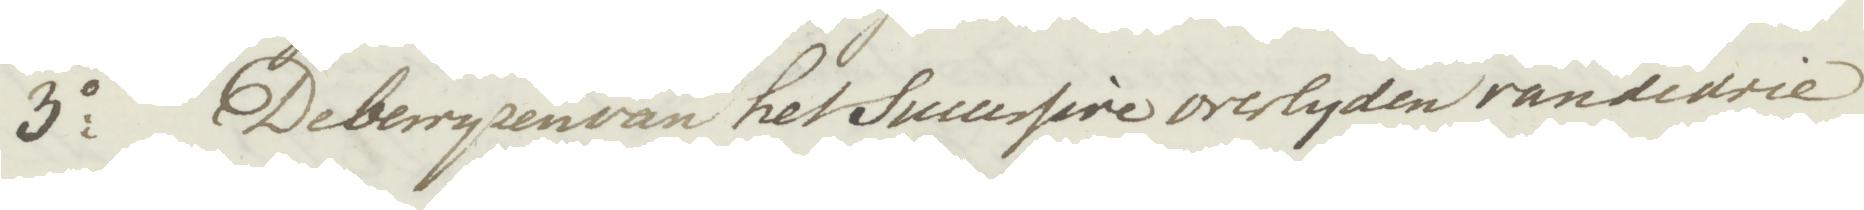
3:o De bewijzen van het Successive overlyden van de drie
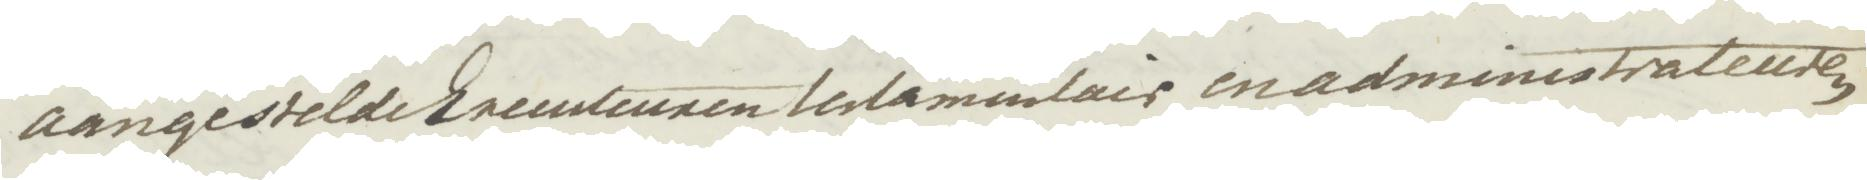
aangestelde Executeuren testamentair en administrateuren
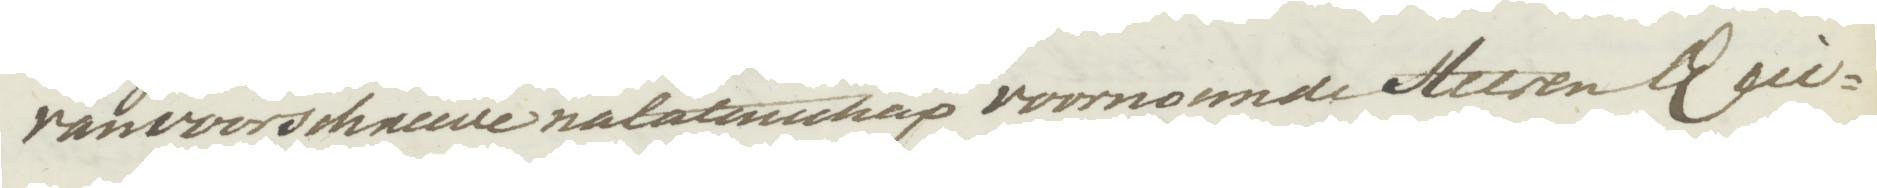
van voorschreeve nalatenschap voornoemde Heeren Qui=
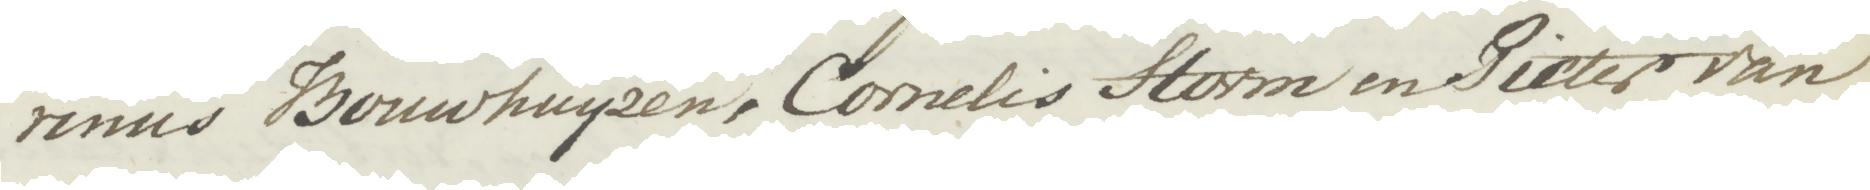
rinus Bouwhuyzen, Cornelis Storm en Pieter van
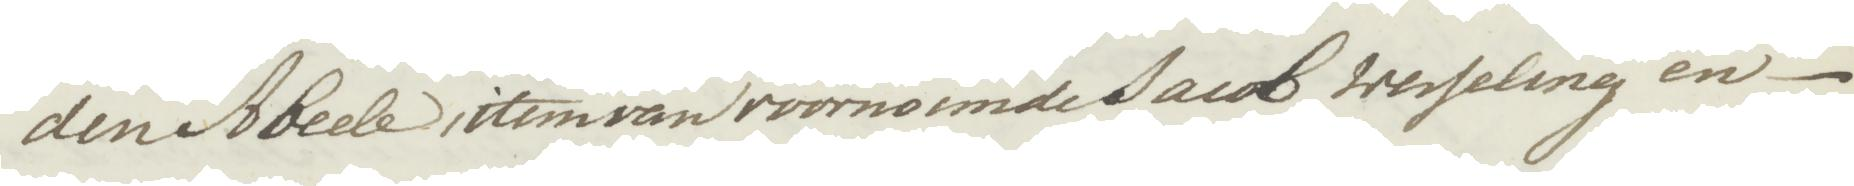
den Abeele, item van voornoemde Jacob Wesseling en —
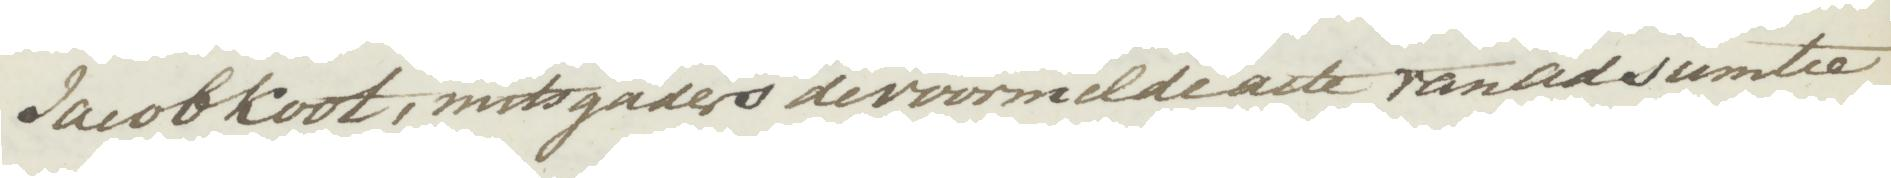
Jacob Koot, mitsgaders de voormelde acte van adsumtie
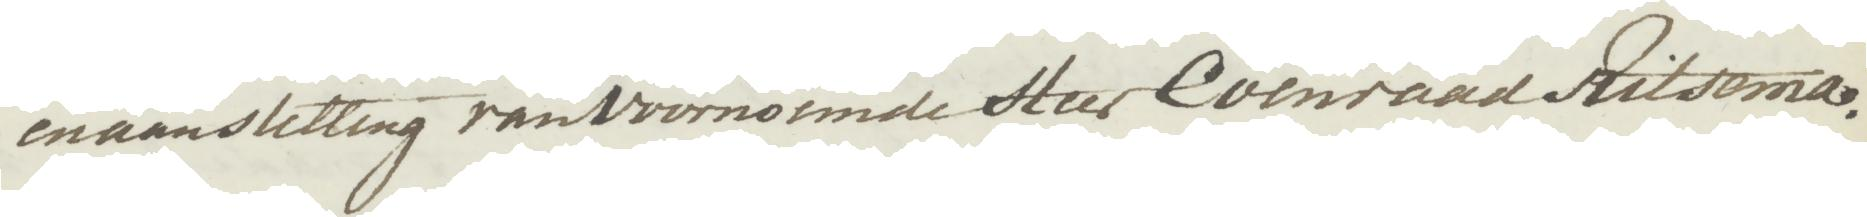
en aanstelling van voornoemde Heer Coenraad Ritsema.
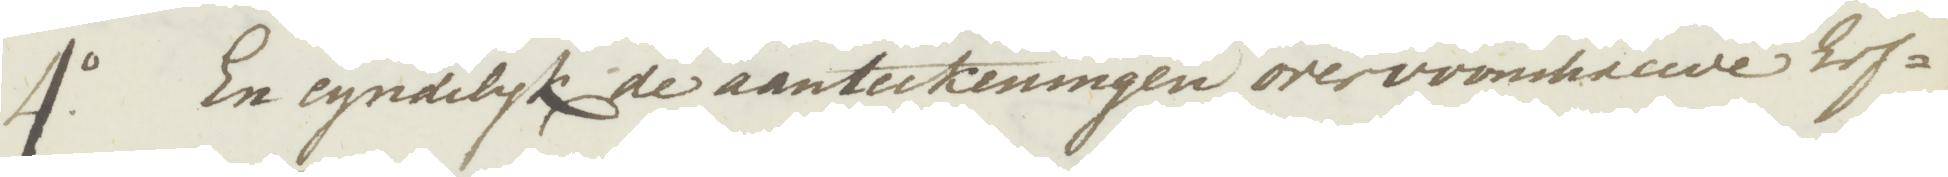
4.o En eyndelijk de aanteekeningen over voorschreeve Erf=
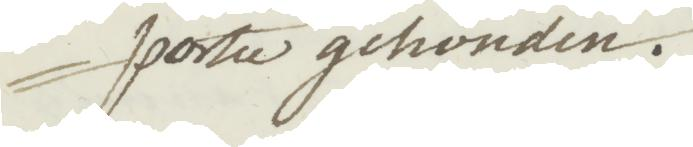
=portie gehouden.
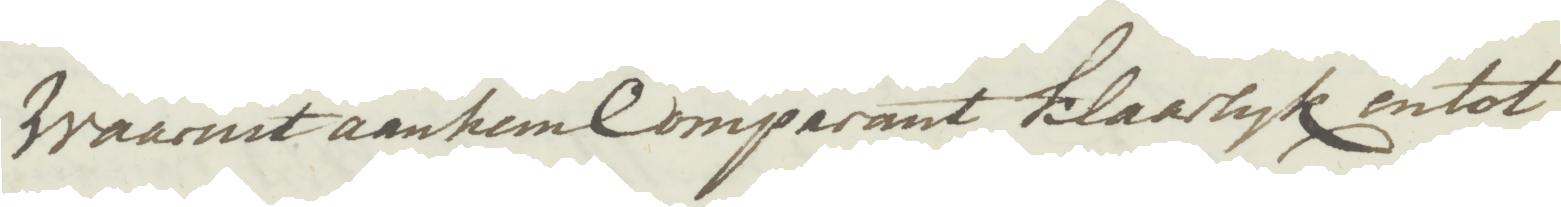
Waaruit aan hem Comparant klaarlyk en tot
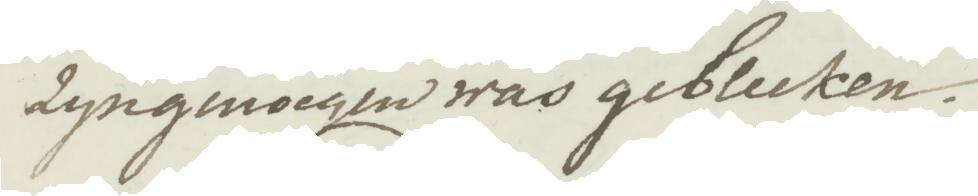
zyn genoegen was gebleeken.
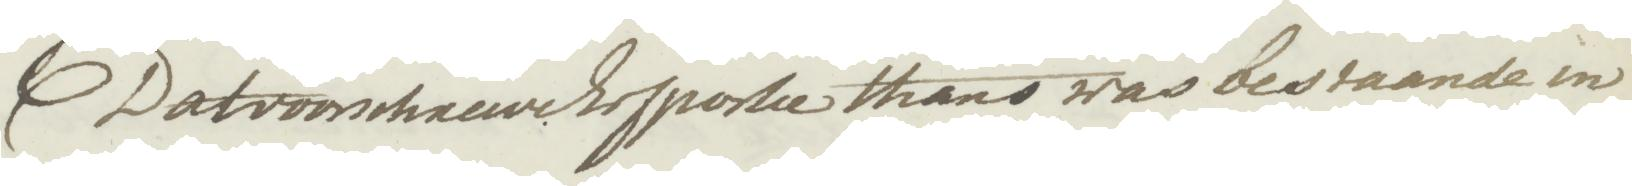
Dat voorschreeve Erfportie thans was bestaande in
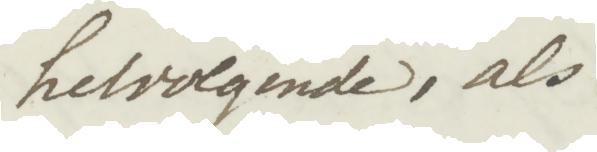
het volgende, als
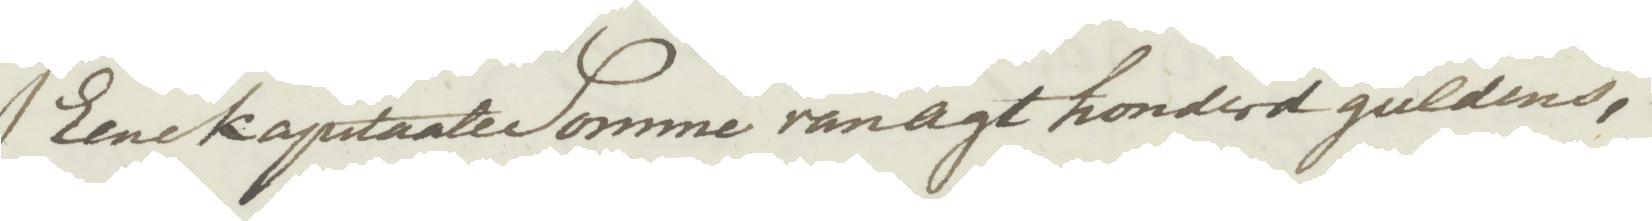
Eene kapitaale Somme van agt honderd guldens,
